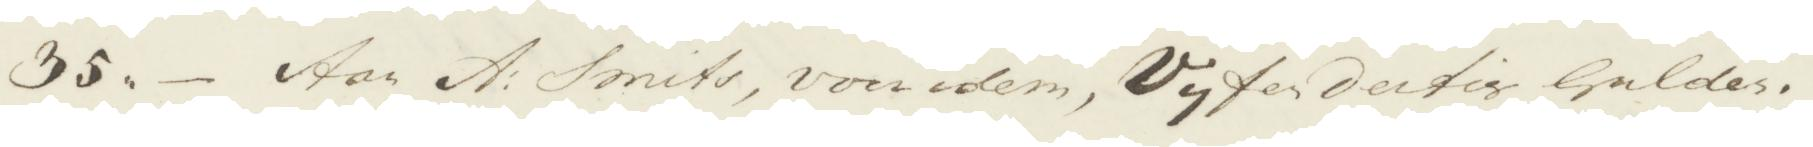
35„ — Aan A: Smits, voor idem, Vyfen dertig Gulden.
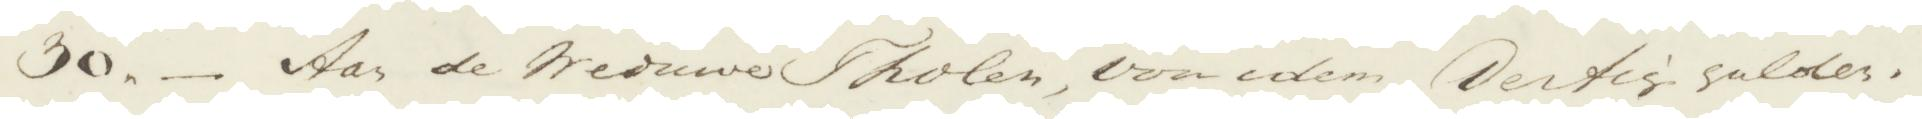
30„ — Aan de Weduwe Tholen, voor idem dertig gulden.
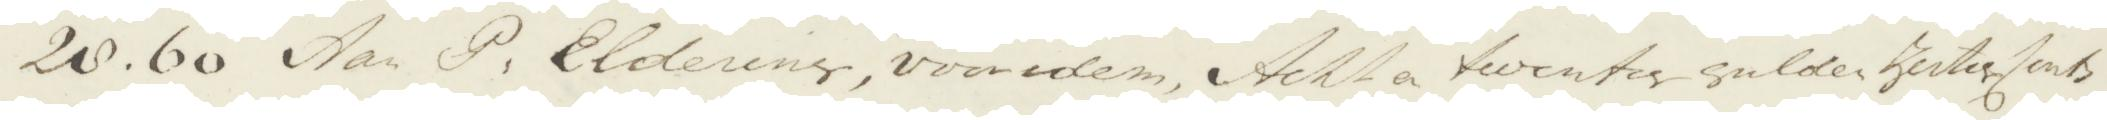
28.60 Aan P. Eldering, voor idem, Achten twintig gulden Zestig Cents
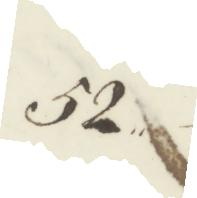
52„
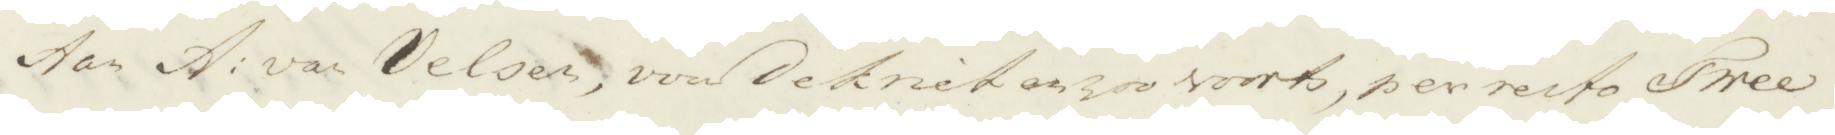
Aan A: van Velsen, voor de kriet en zoo voorts, per recto Twee
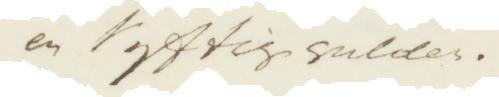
en Vyftig gulden.
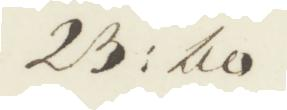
23: 40
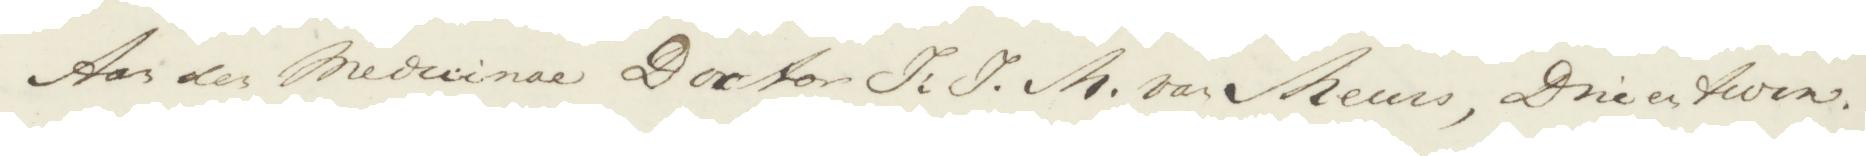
Aan den Medicinae Doctor I: I. M. van Meurs, Drie en twin,
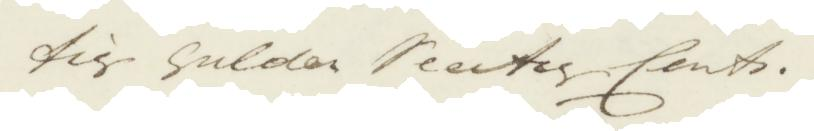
tig Gulden Veertig Cents.
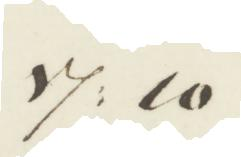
17: 10
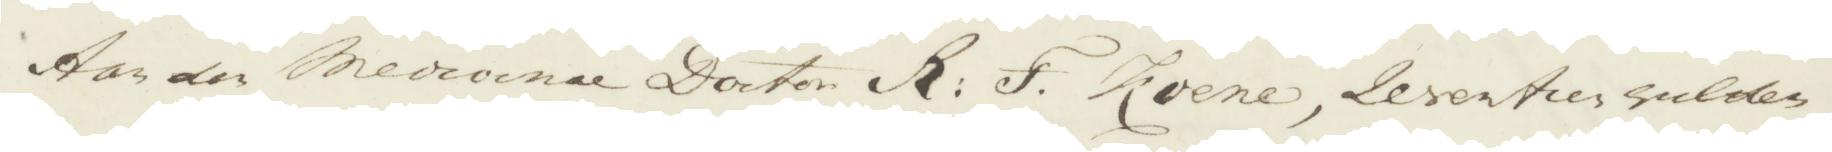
Aan den Medicinae Doctor R: F. Koene, Zeventien gulden
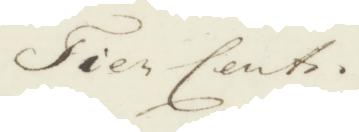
Tien Cents.
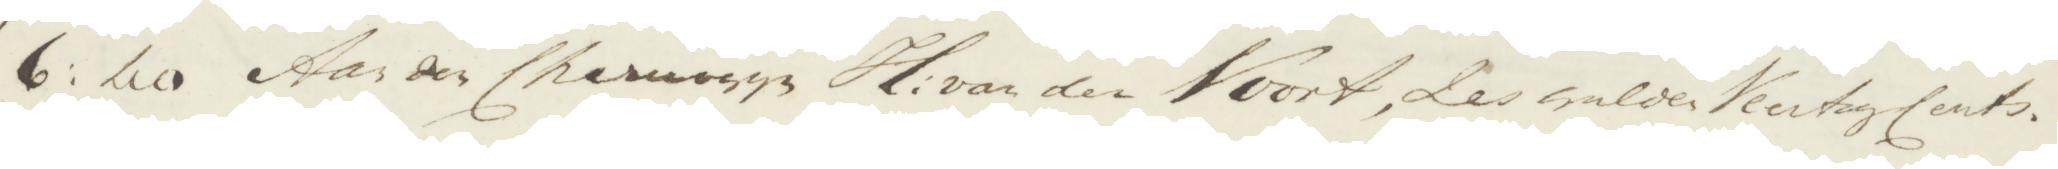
6: 40 Aan den Chirurgyn H: van der Voort, Zes gulden Veertig Cents.
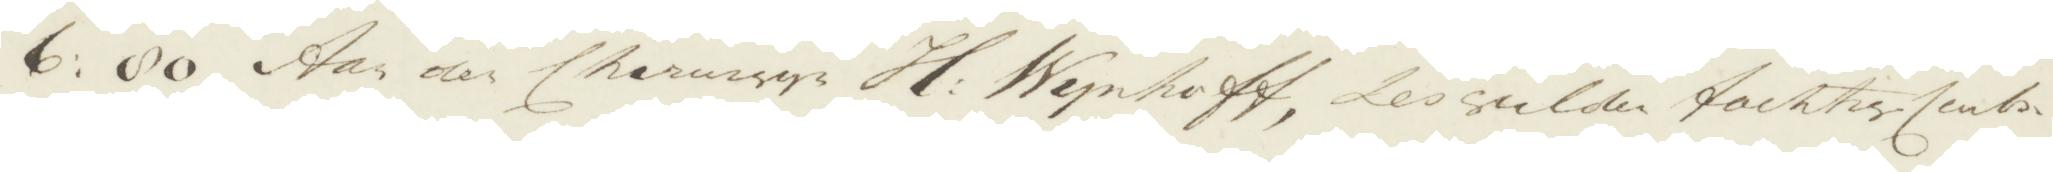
6: 80 Aan den Chirurgyn H: Wynhoff, Zes gulden tachtig Cents.
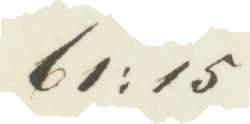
61:15
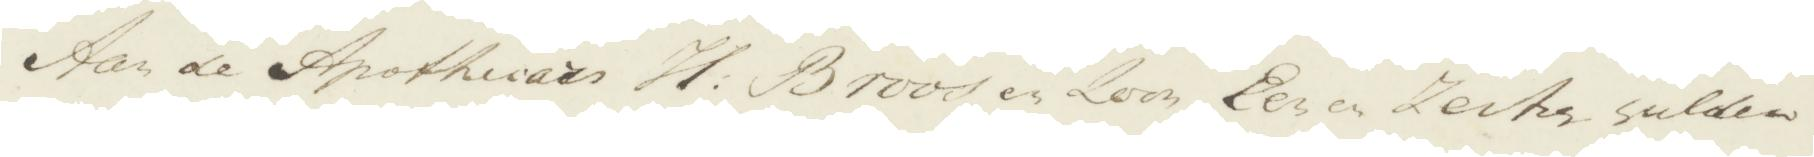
Aan de Apothecars H: Broos en Zoon Een en Zestig gulden
